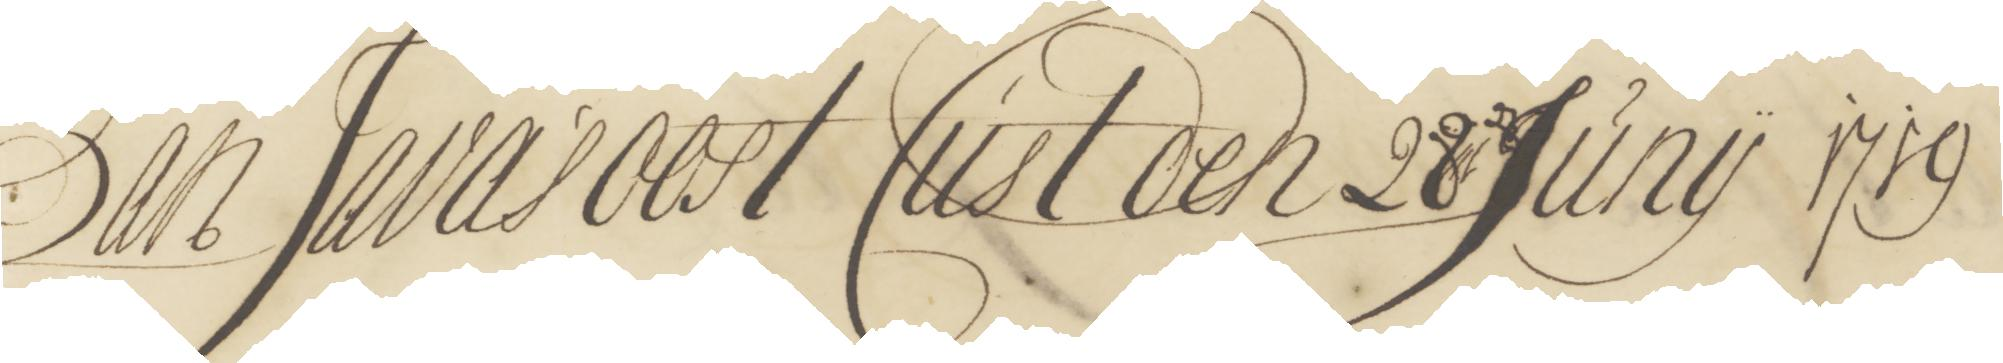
Van Java's oost Cust den 28„en Junij 1719
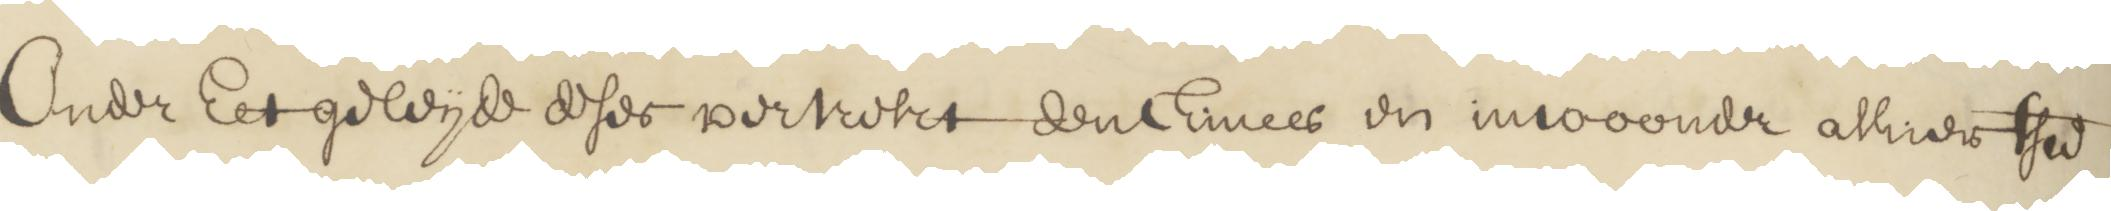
Onder het geleijde deses vertrekt den chinees en inwoonder alhier tsie
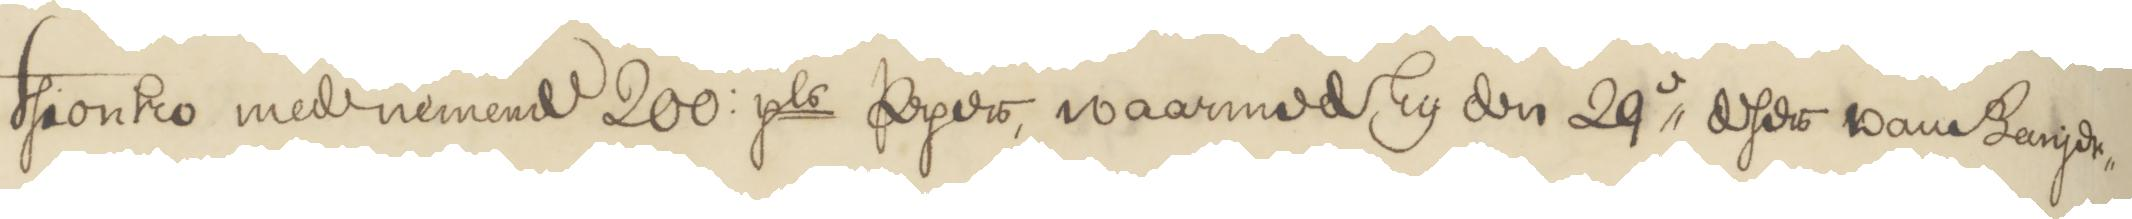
tsionko medenemende 200: p=ls Peper, waarmede hij den 24„e deser van Banjer„
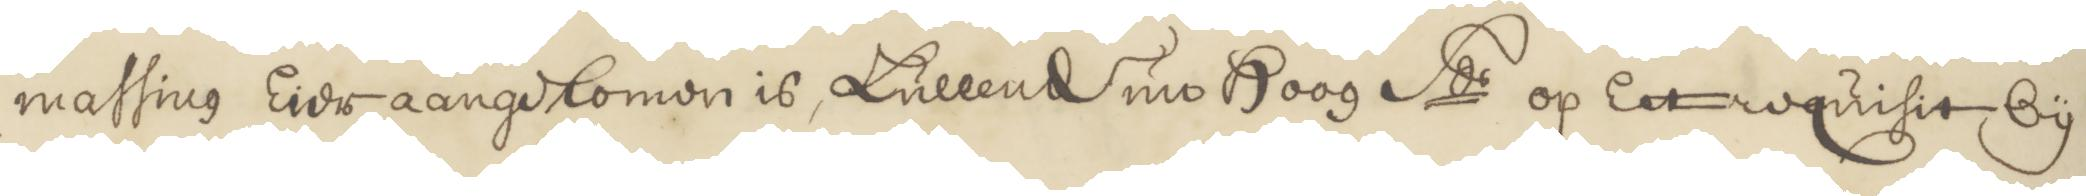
„massing hier aangekomen is, zullende uw Hoog Ed=s op het requisit bij
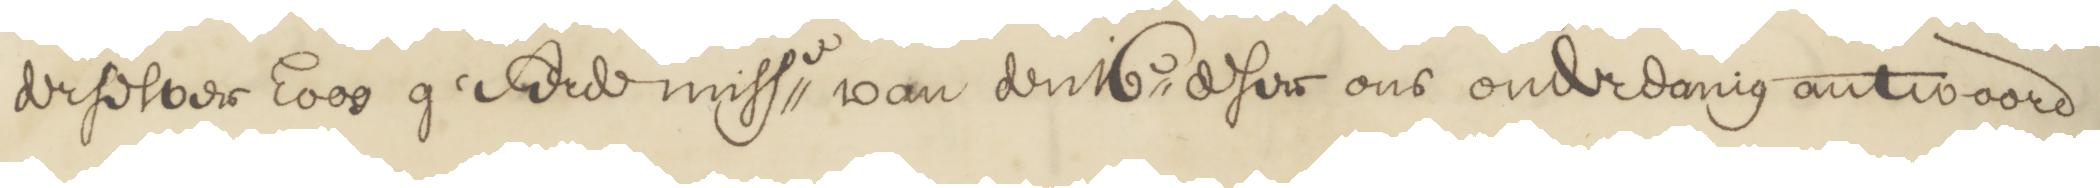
derselver hoog g'Eerde miss„e van den 16„e deser ons onderdanig antwoord
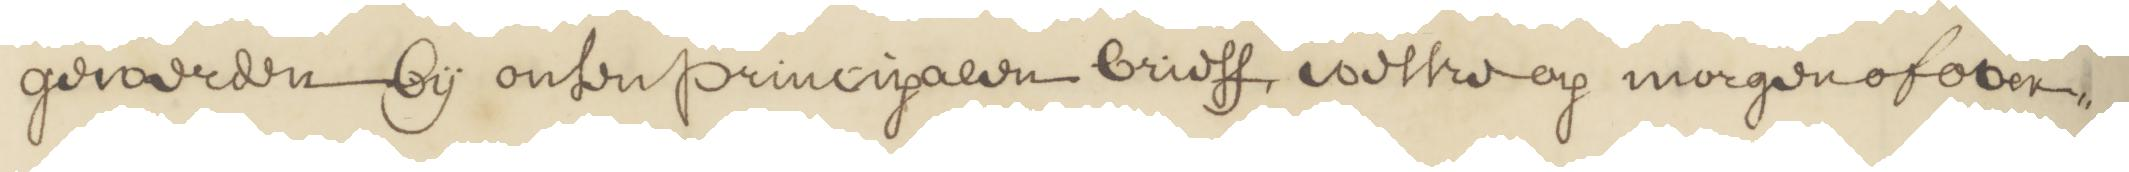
gewerden bij onsen principalen brieff, welke op morgen of over„
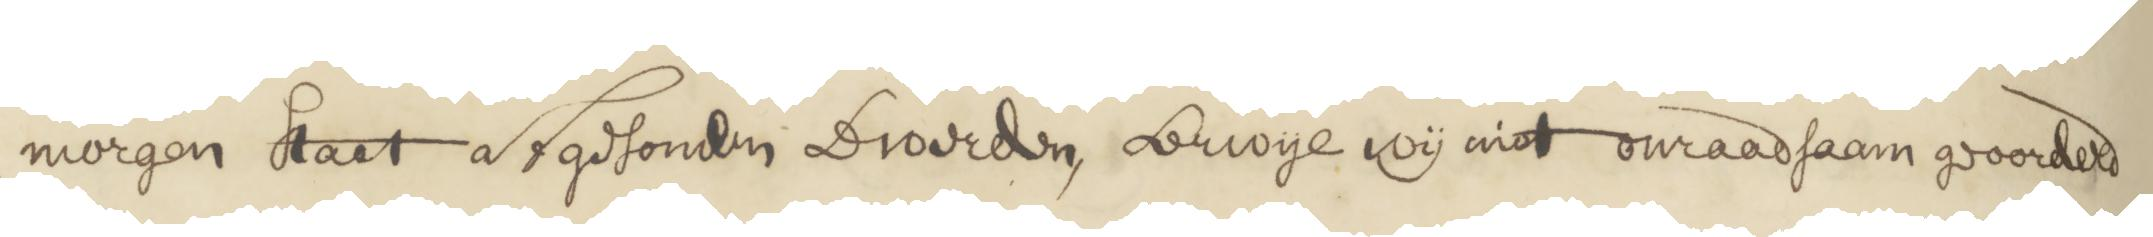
morgen staet afgesonden tewerden, terwijl wij niet onraadsaam geoordeld
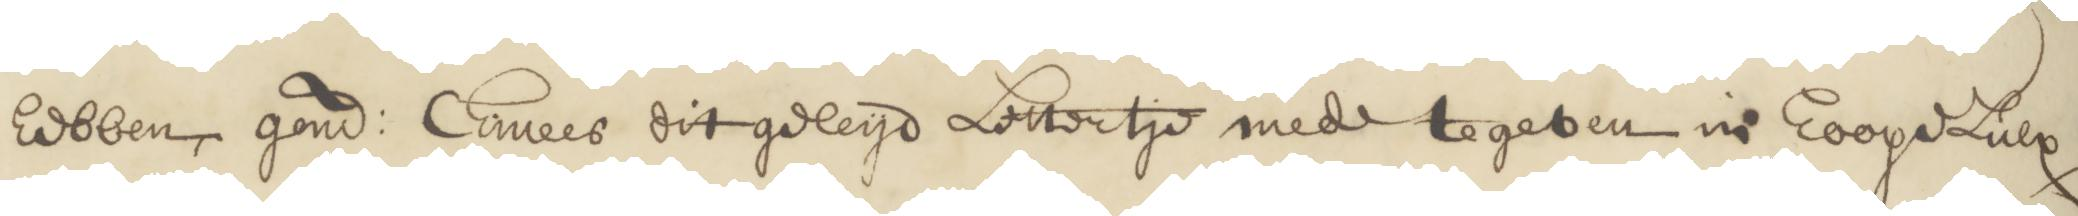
hebben gem: Chinees dit geleijd lettertje mede tegeven in hoope zulx
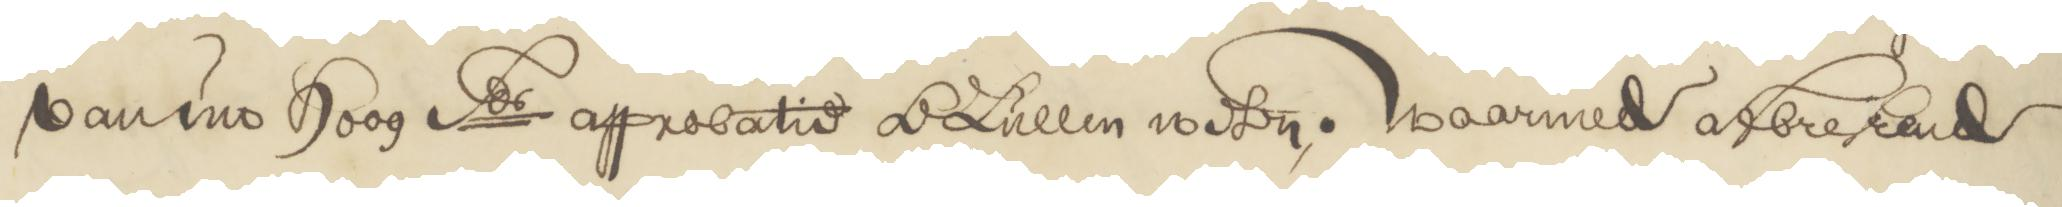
van uw Hoog Ed=s approbatie te zullen wesen, waarmede afbrekende
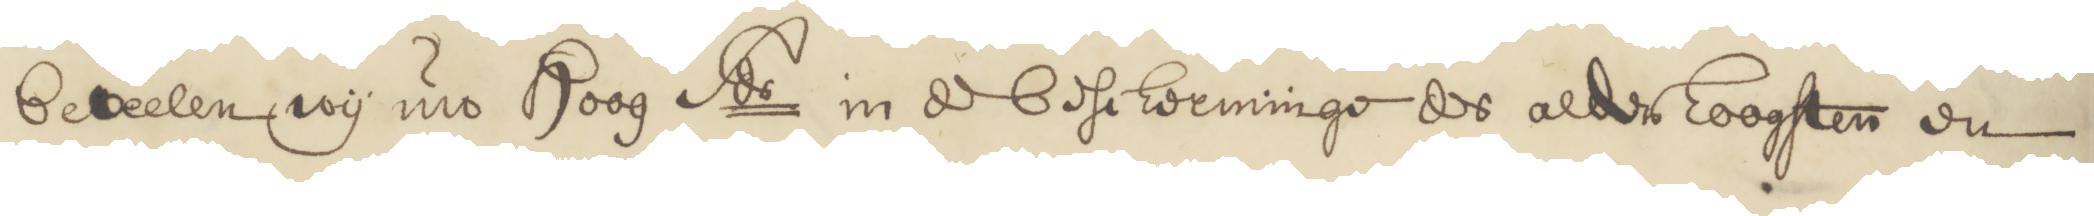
beveelen wij uw Hoog Ed=s in de bescherminge des alder hoogsten en
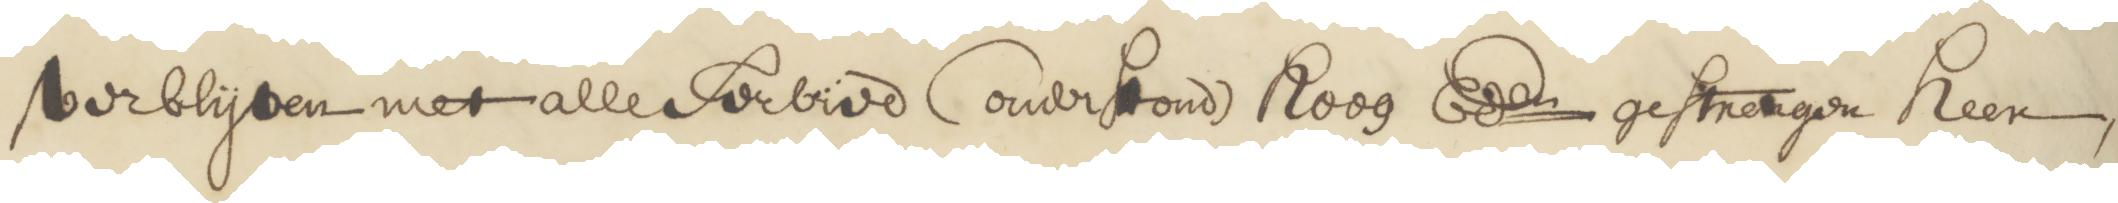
verblijven met alle Eerbied (onderstond) Hoog Ed=ee gestrengen heer,
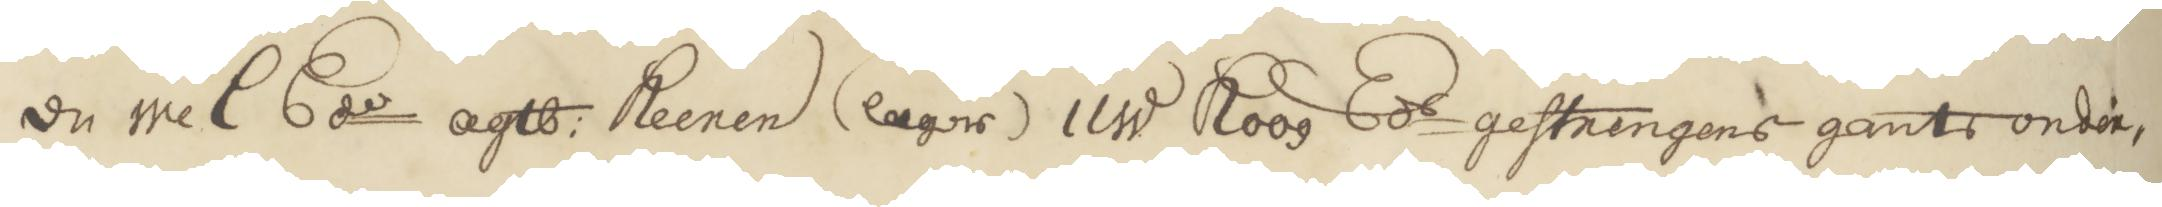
en wel Ed=e agtb: Heeren (lager) uw Hoog Ed=s gestrengens gants onder„
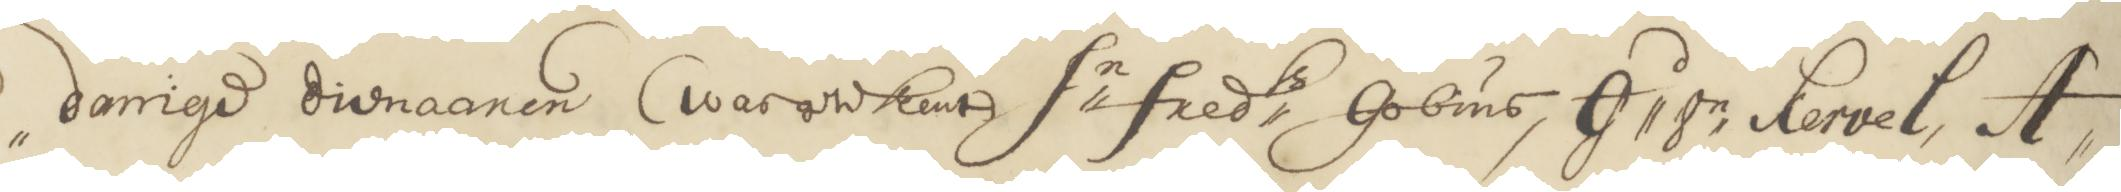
„danige dienaaren (was getekent) J„n Fred„k Gobius, G„d v„n kervel, A„
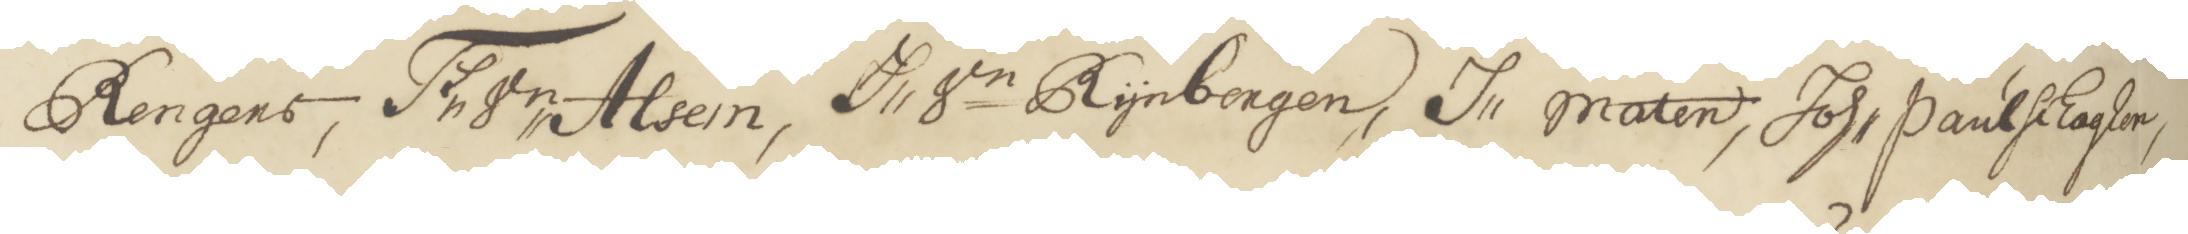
Rengers, T„s V„n Alsem, J„ V=n Rijnbergen, J„ maten, Joh„ Paul schaghen,
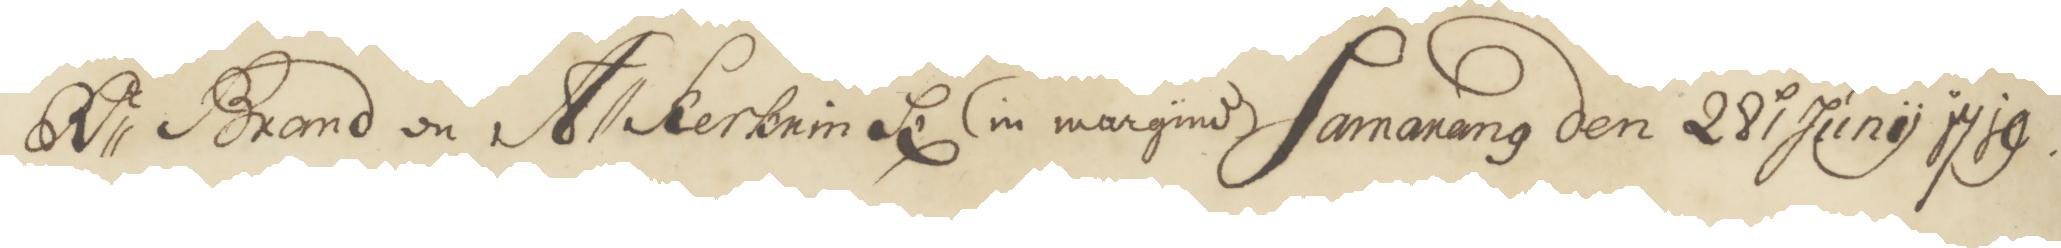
R„r Brand en A„ kerkrin sr (in margine) Samarang den 28„e Junij 1719. —
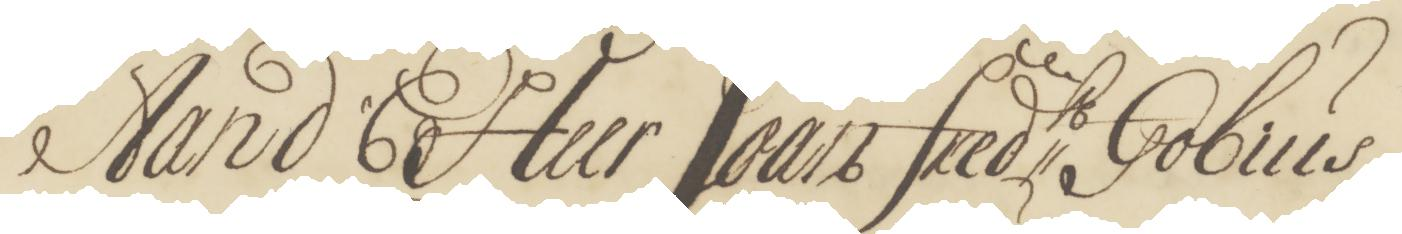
Aan d' Ed Heer Joan Fred„k Gobius
